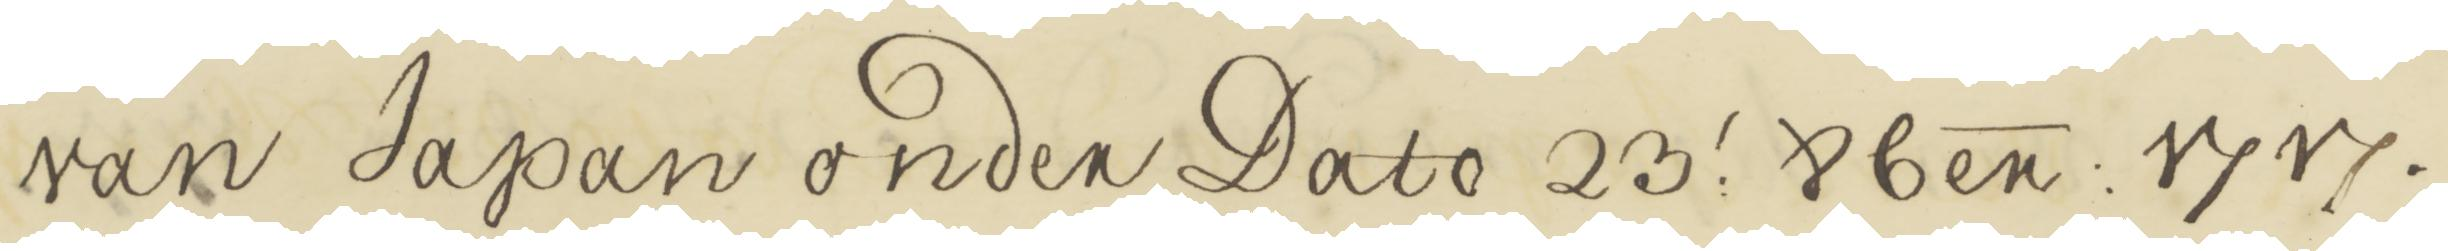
van Iapan onder Dato 23:' 8ber: 1717.
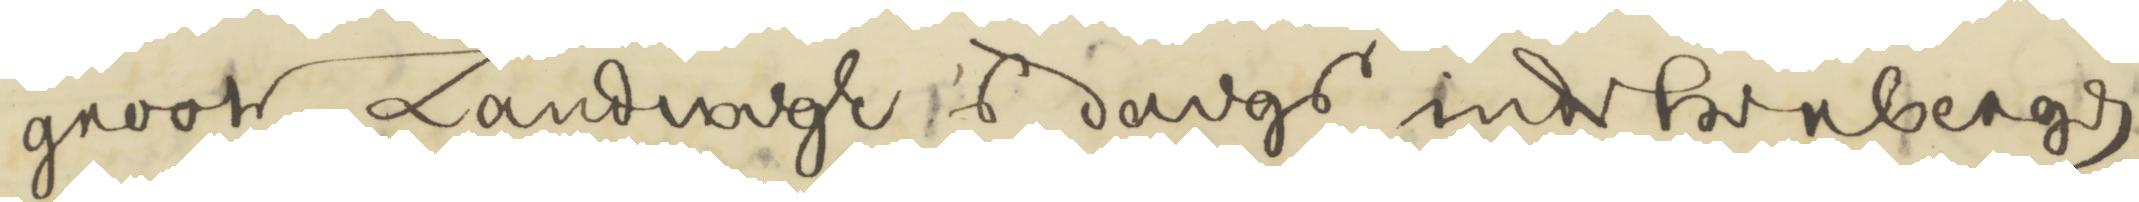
groot, Landwegh 's daegs inde herbergen
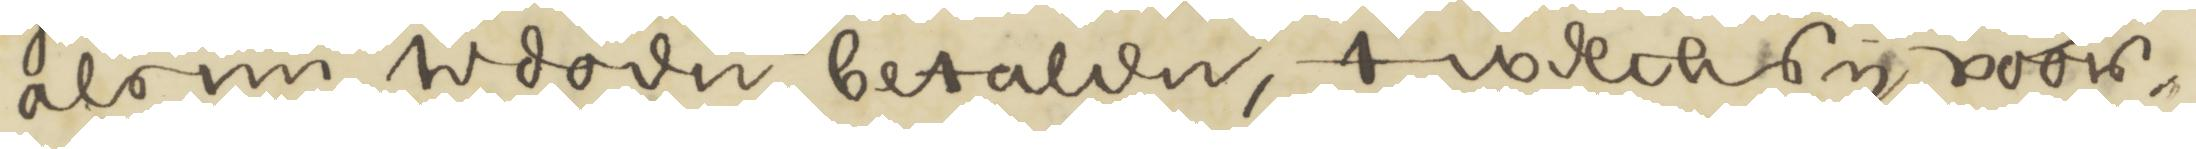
als nu tedoen betalen, t welck sij voor„
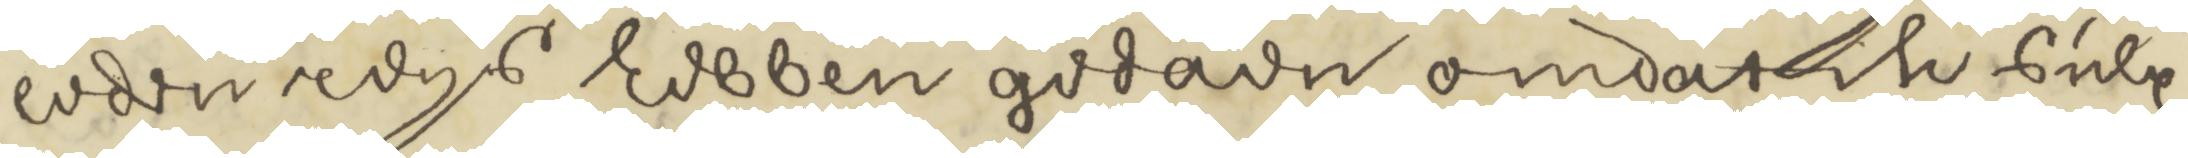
leden reijs hebben gedaen omdat ik sulx
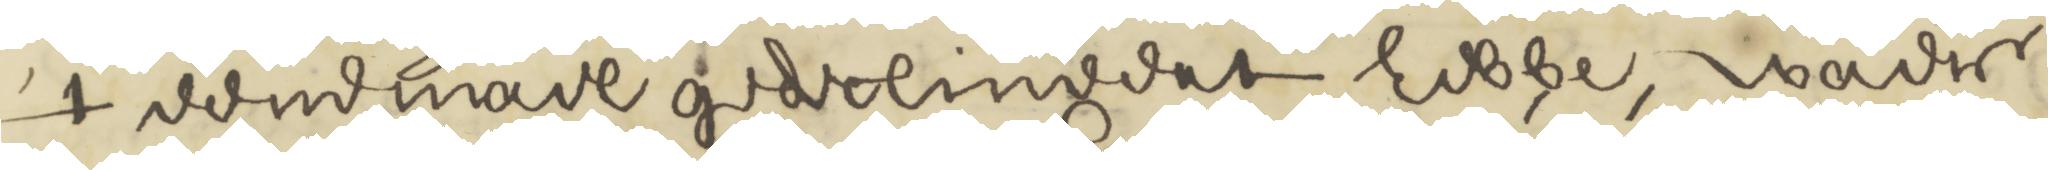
’t eenemael gedeclineert hebbe, waer
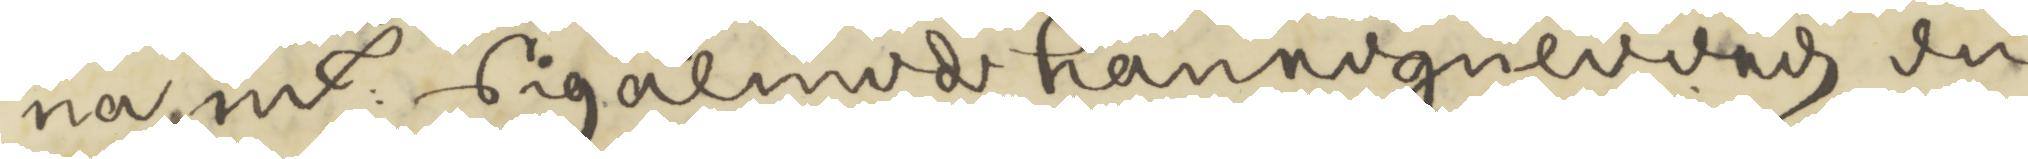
na uE: sig almede kanreguleeren en
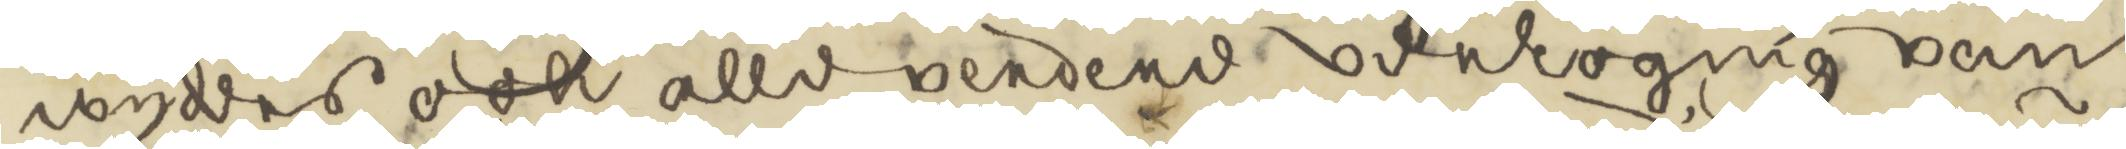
wijders ook alle verdere verhoging van
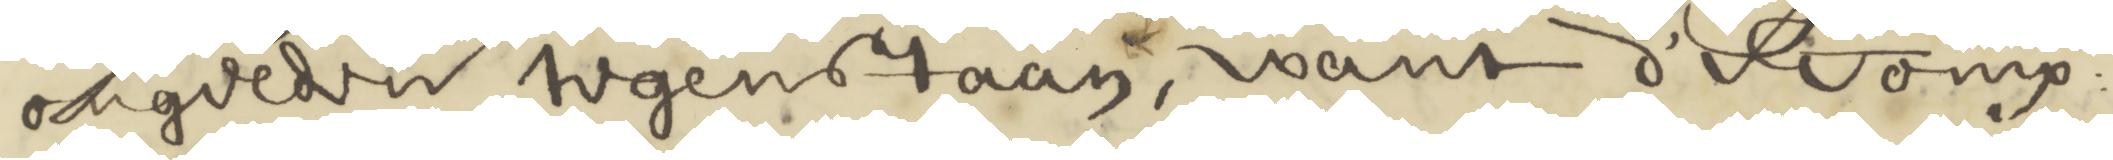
ongelden tegenstaan, want d’EComp:
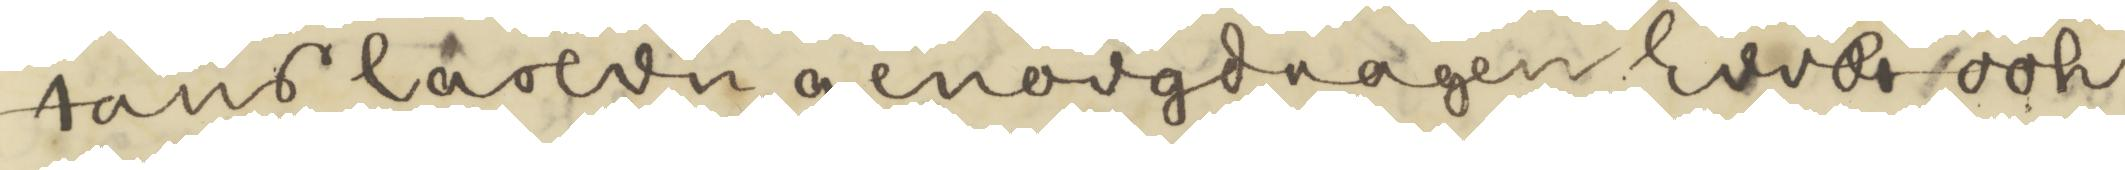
tans lasten genoegdragen heeft, ook
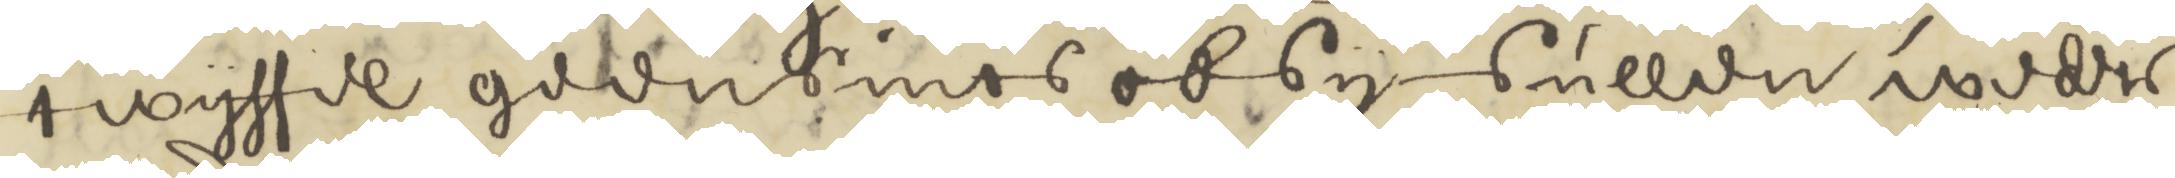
twijffel geensints of sij sullen weder
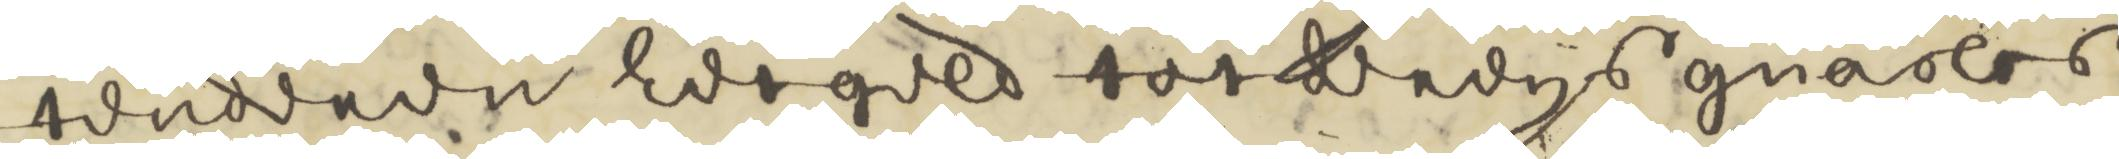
tenderen hetgeld tot dereijs guastos
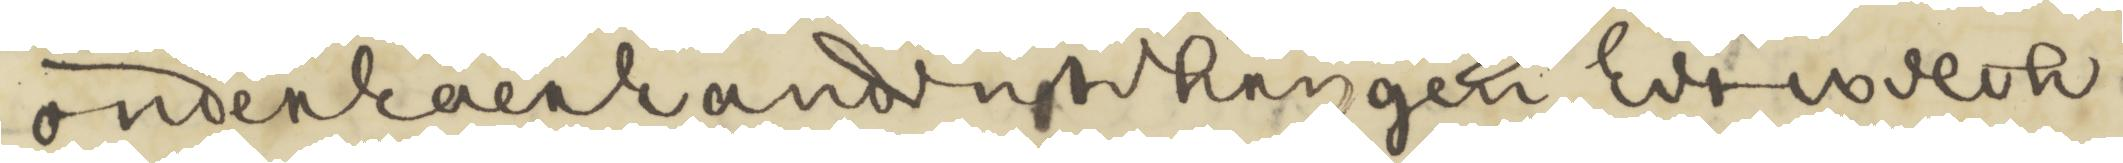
onder haer handen tekrijgen het welck
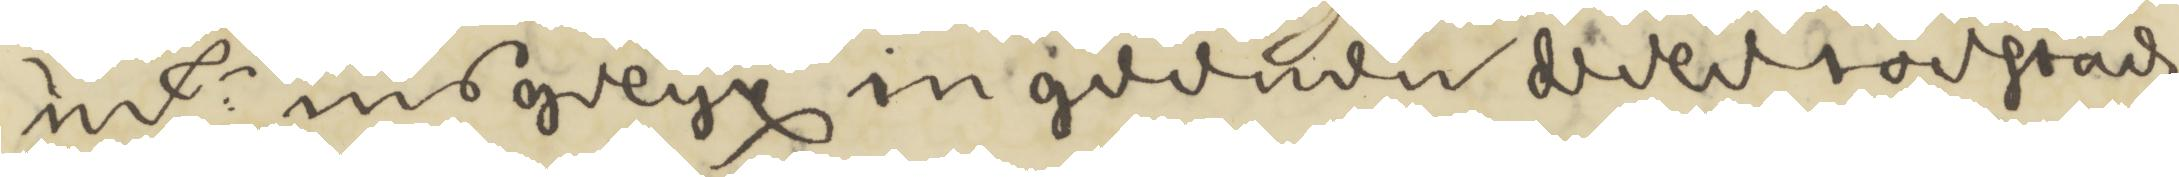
uE: insgelijx in geenen deele toestaen
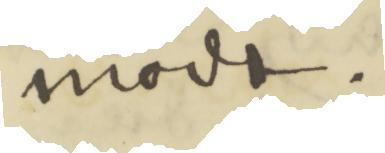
moet.
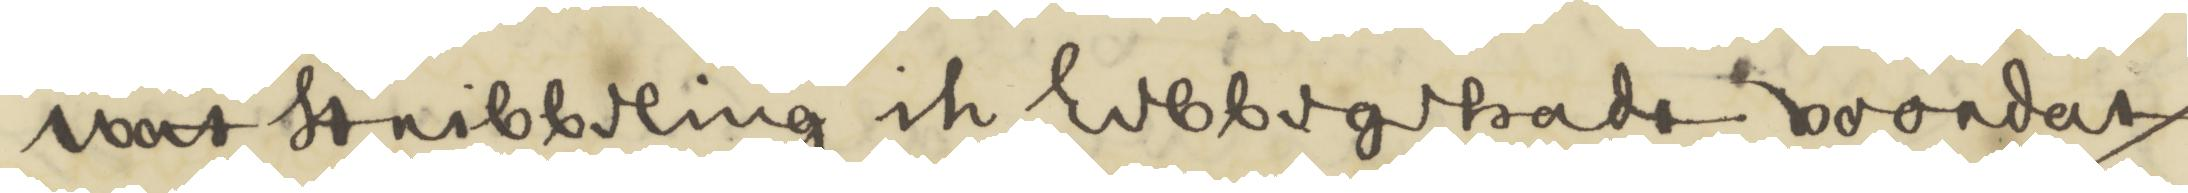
wat stribbeling ik hebbegehadt voordat
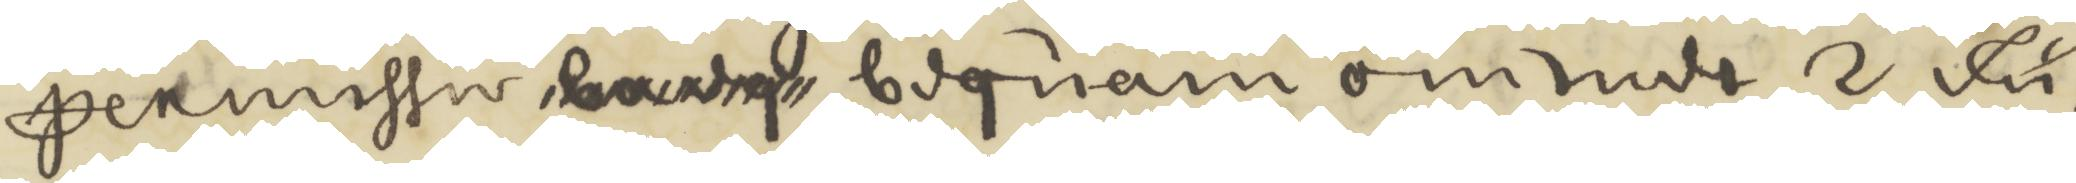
permissie baeq bequam om met 2 Eu
